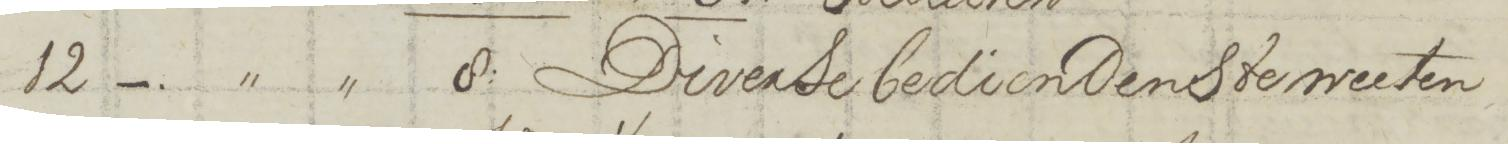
12 —. „ „ 8: Diverse bediendens te weeten
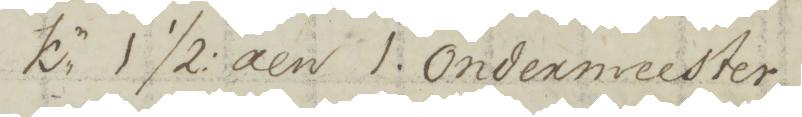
k„n 1 ½: aen 1. Ondermeester
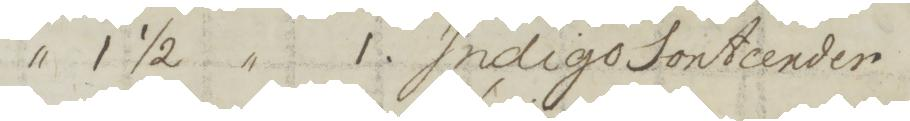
„ 1 ½ „ 1. Jndigo sorteerder
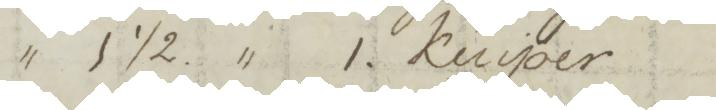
„ 1 ½. „ 1. kuiper
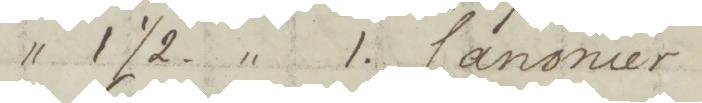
„ 1 ½. „ 1. Canonier
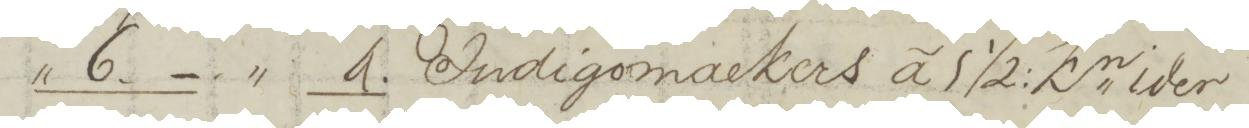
„ 6. —. „ 4. Indigomaekers â 1 ½: k„n ider
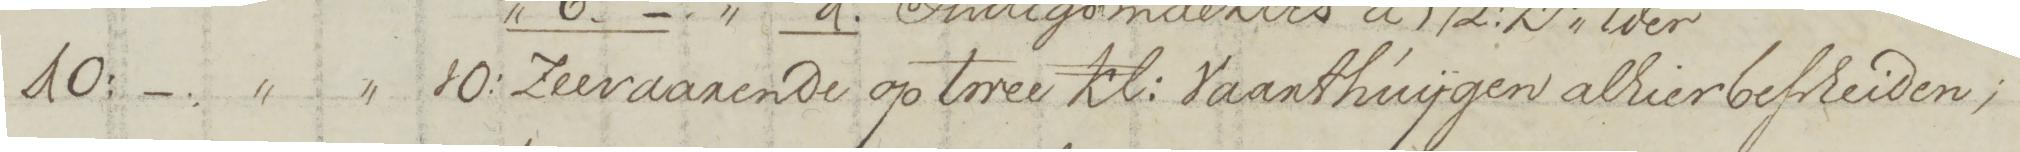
40: —: „ „ 10: zeevaarende op twee kl: vaarthuijgen alhier bescheiden;
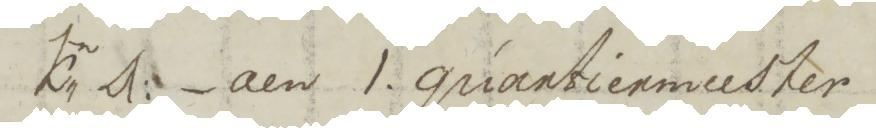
k„n 4: — aen 1. quartiermeester
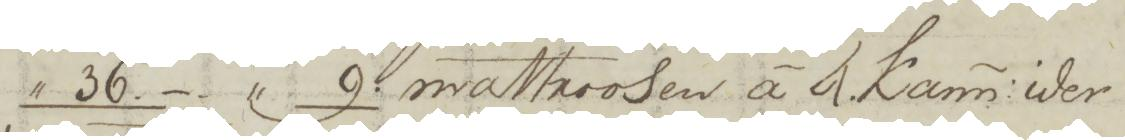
„ 36. —. „ 9. mattroosen â 4. kann: ider
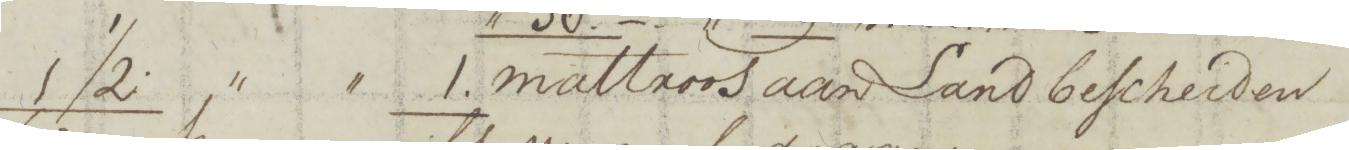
1 ½. „ „ 1. mattroos aan Land bescheiden
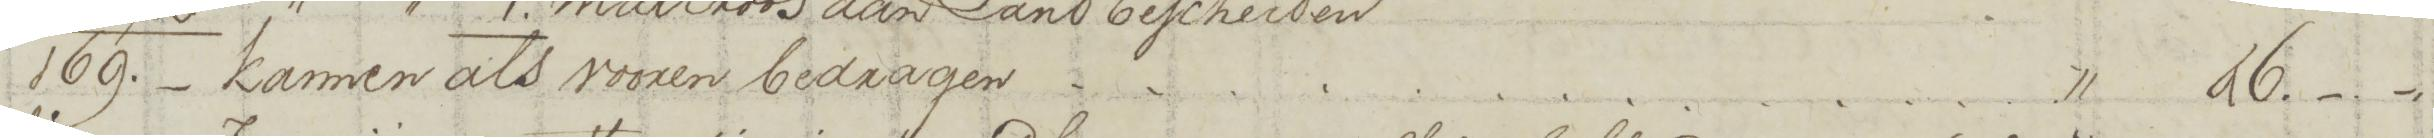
169. — kannen als vooren bedragen - - - - - - - - - - - - - - - „ 46. —. —
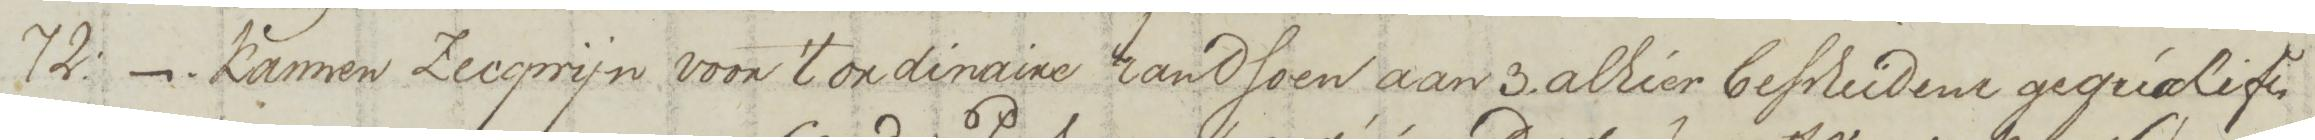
72: —. kannen zecqwijn voor 't ordinaire randsoen aan 3. alhier bescheidene gequalifi„
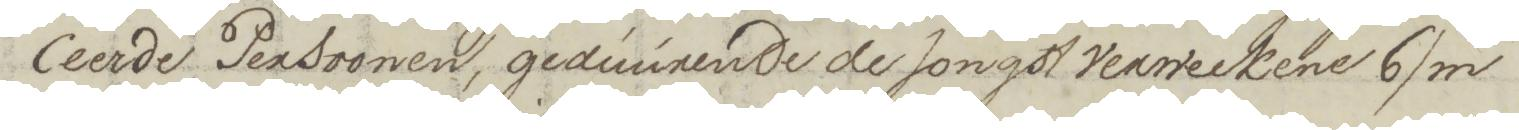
ceerde Persoonen, geduurende de Jongst verweekene 6/m
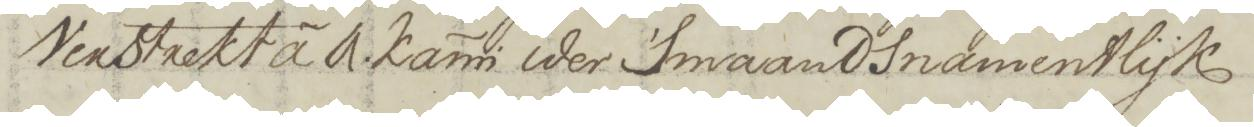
verstrekt â 4. kann. ider 'smaands namentlijk
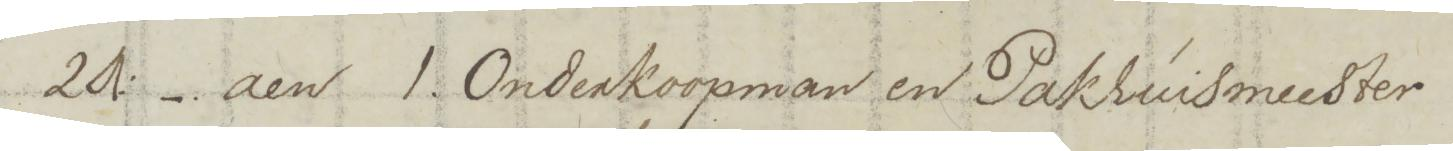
24: —. aen 1. Onderkoopman en Pakhuismeester
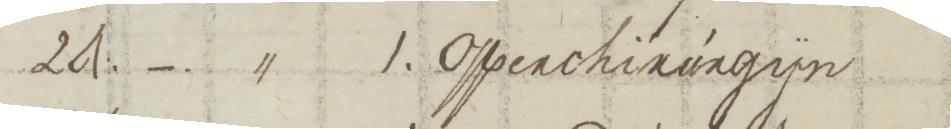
24: —. „ 1. Opperchirurgijn
